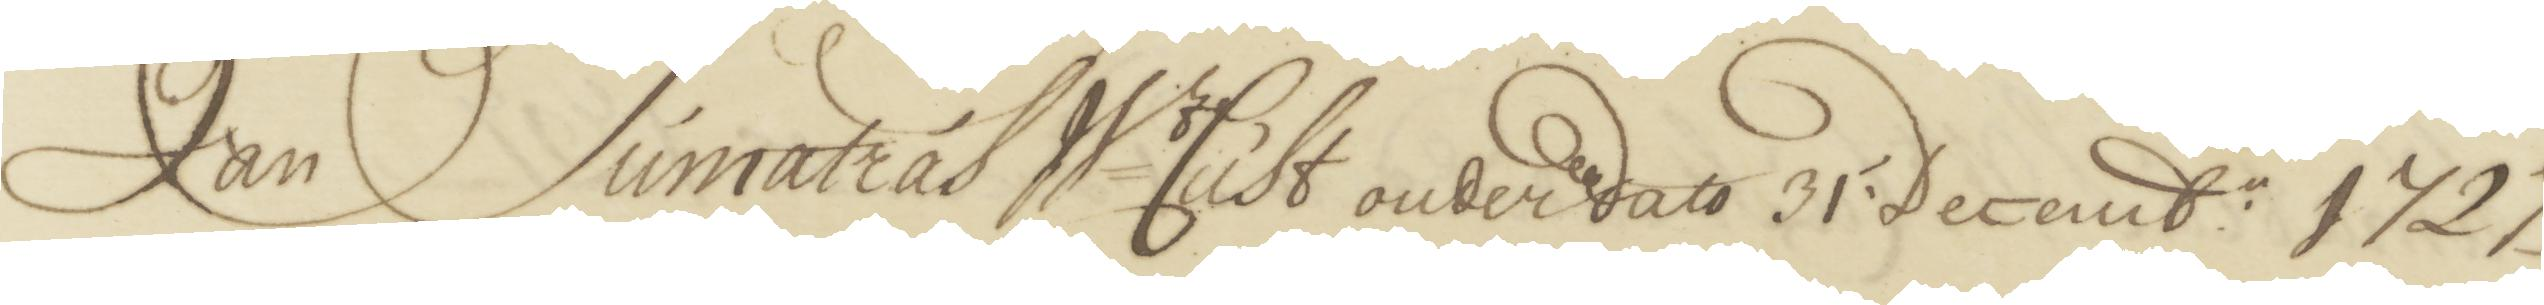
Van Sumatras W=t Cust onder dato 31.' Decemb:r 1727_
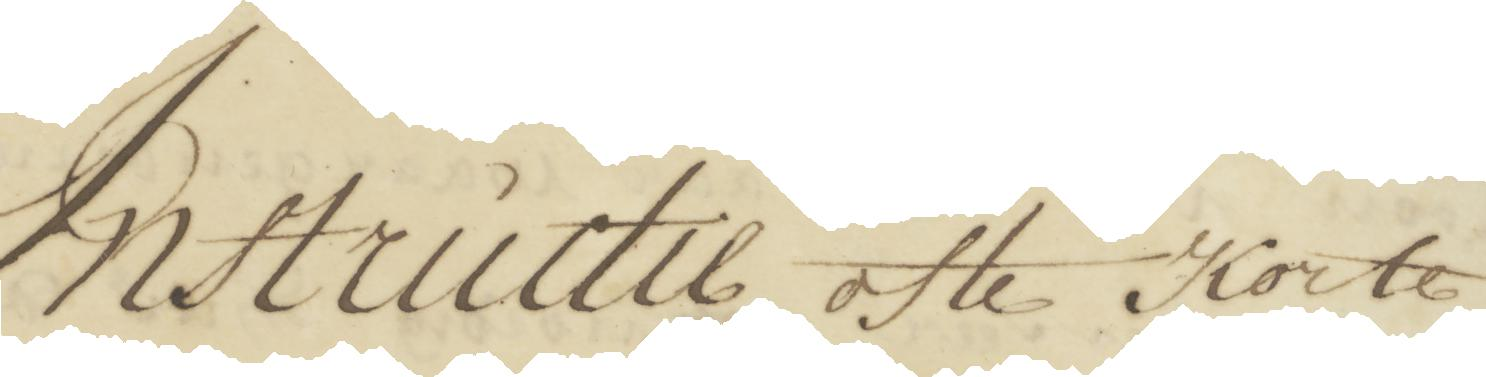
Instructie ofte Korte
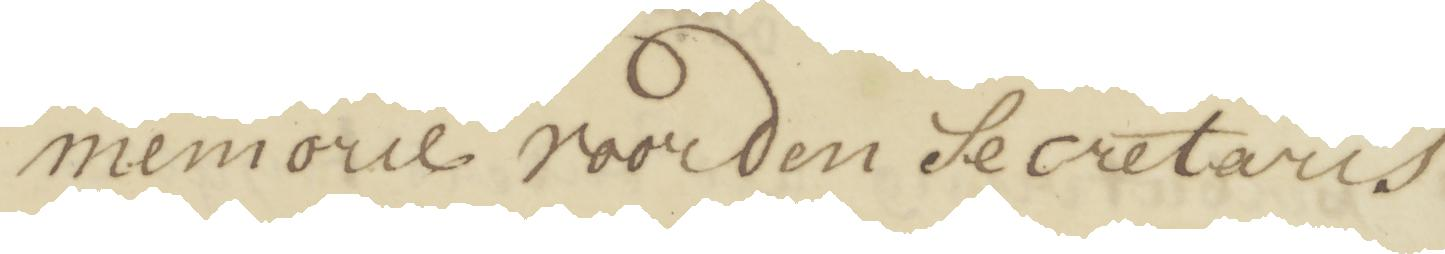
memorie voor den secretaris
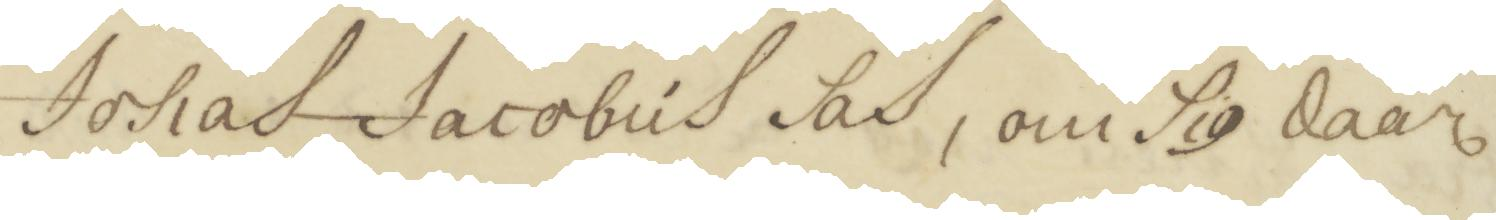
Josias Jacobus sas, om sig daar
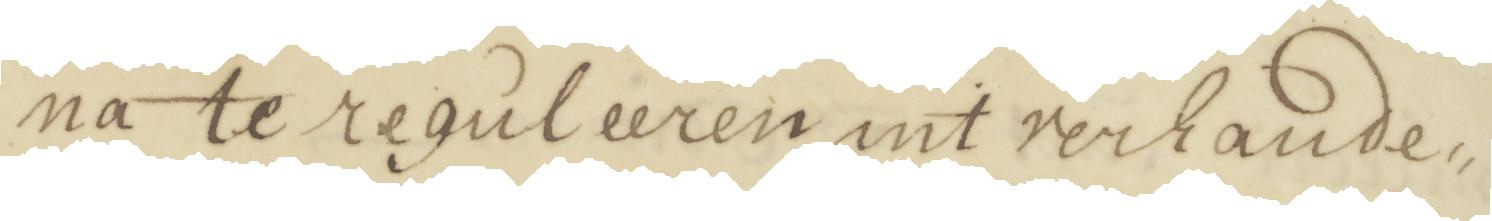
na te reguleeren in’t verhande„
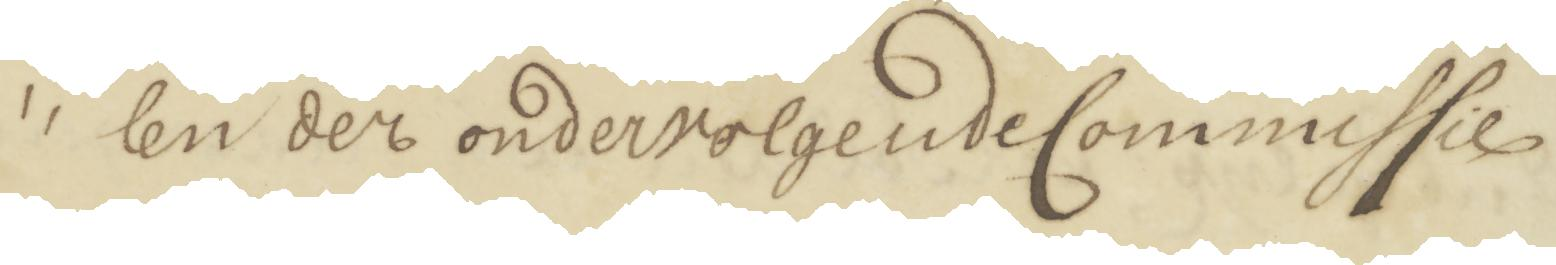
„len der ondervolgende Commissie
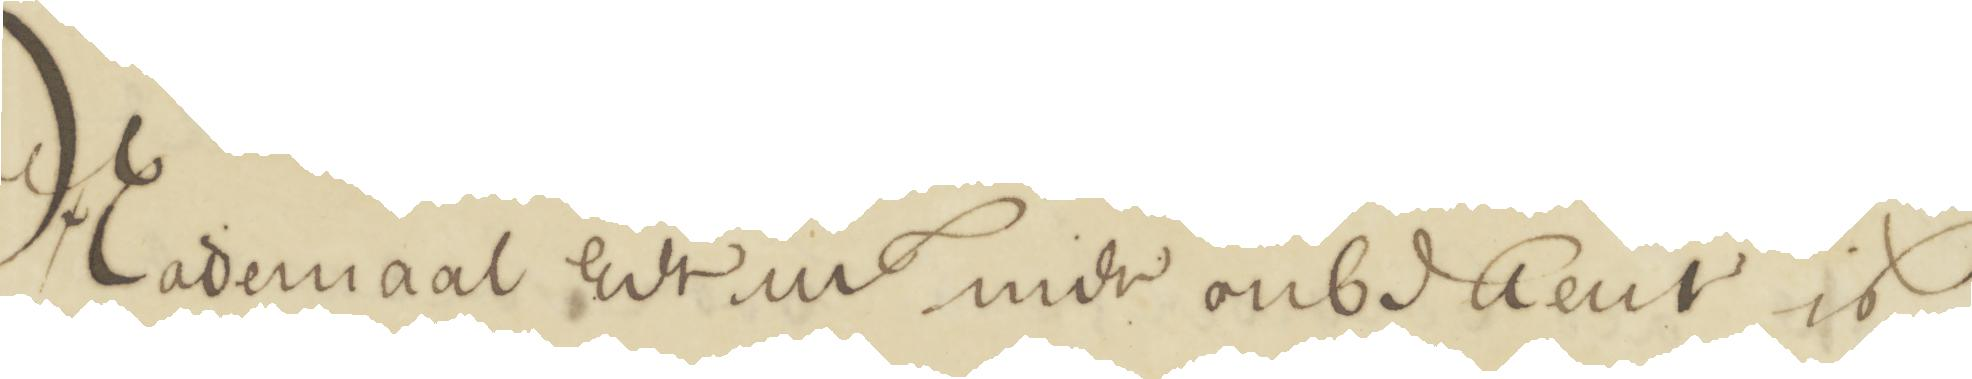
Nademaal het uE niet onbekent is
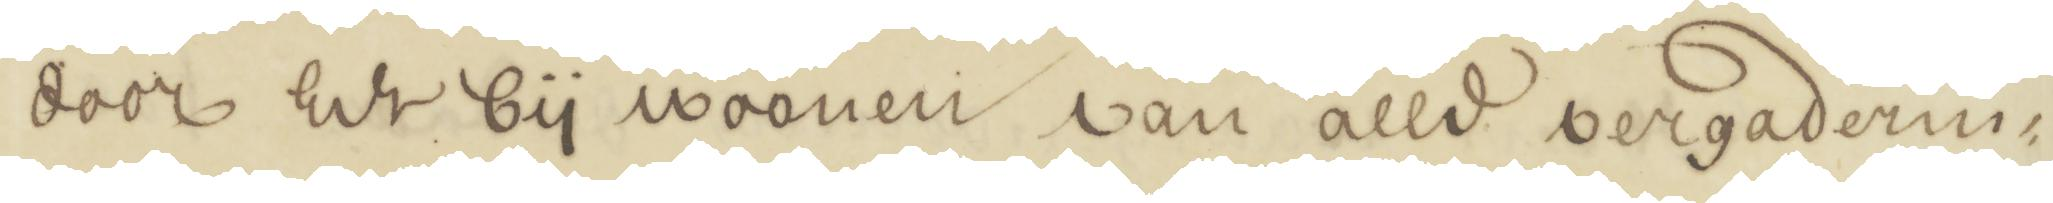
door het bij woonen van alle vergaderin„
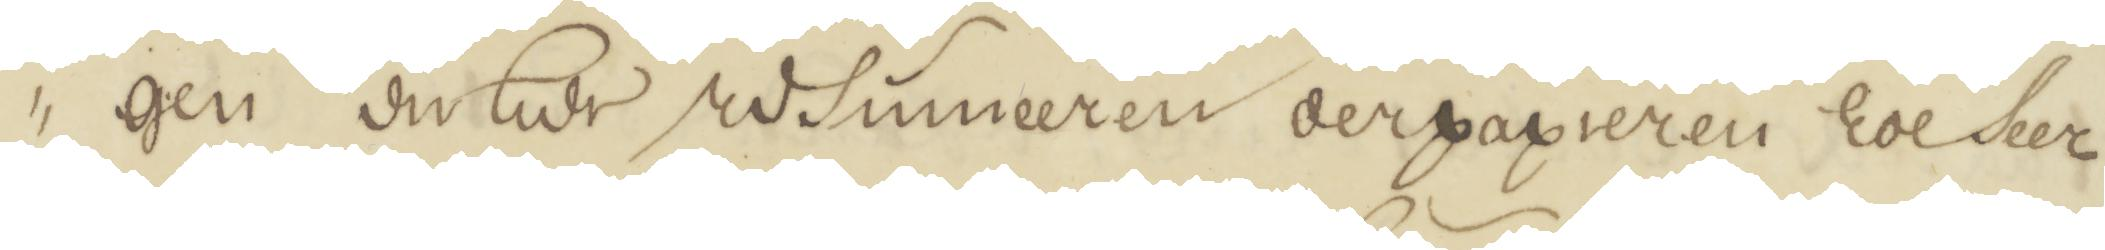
„gen en het resumeeren der papieren hoe seer
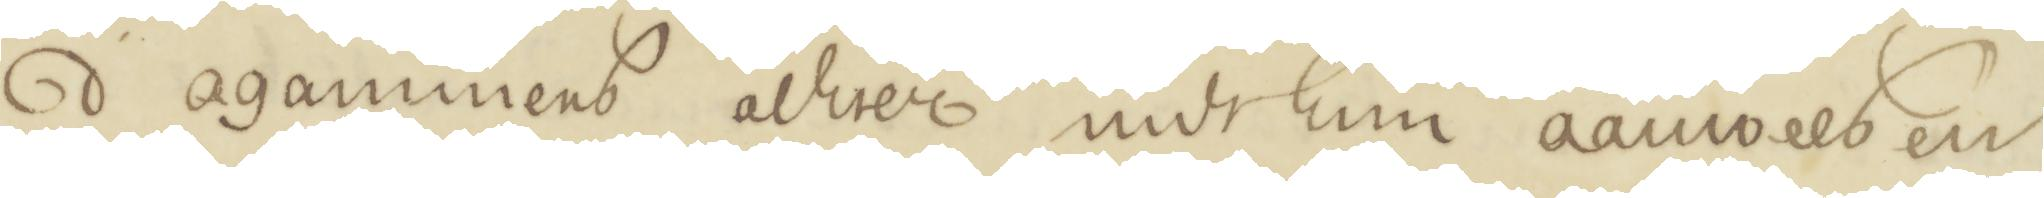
d’ agammers alhier met hun aanweesen
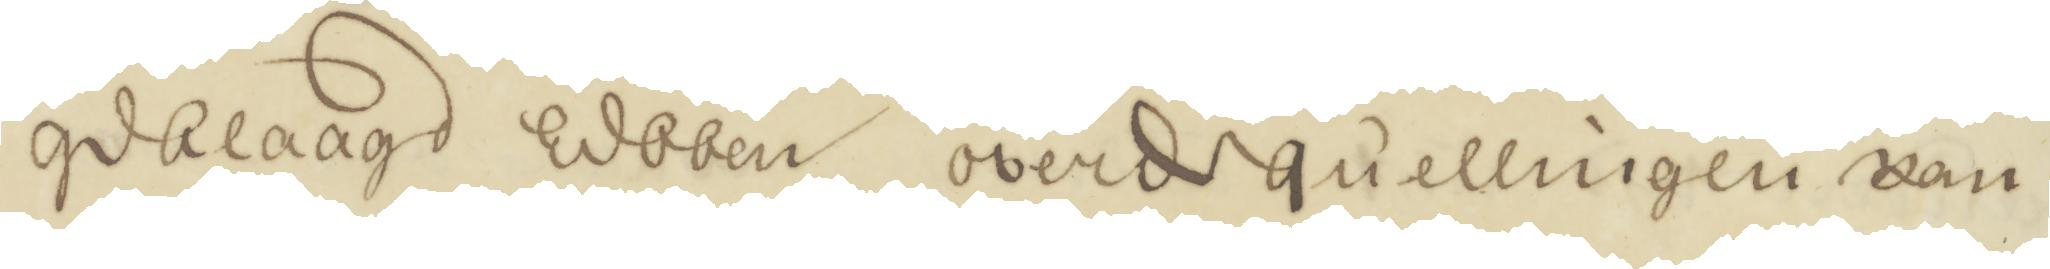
geklaagd hebben over de quellingen van
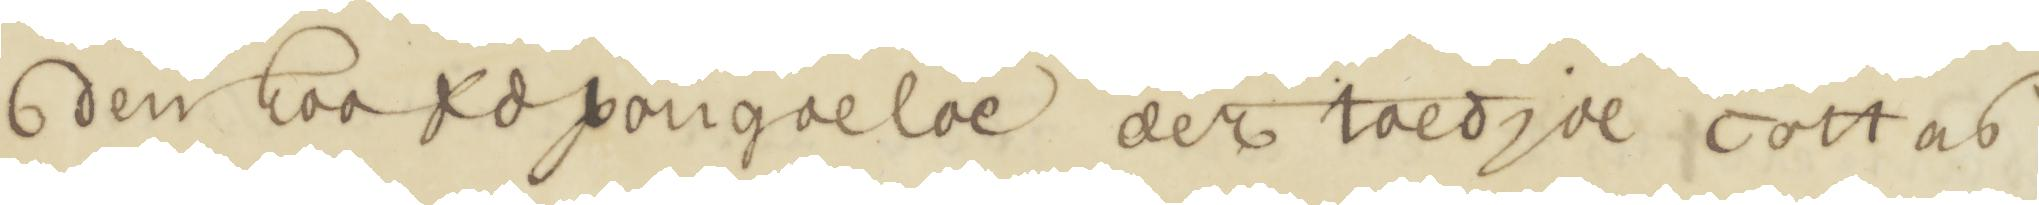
den hoofdpongoeloe der toedjoe cottas
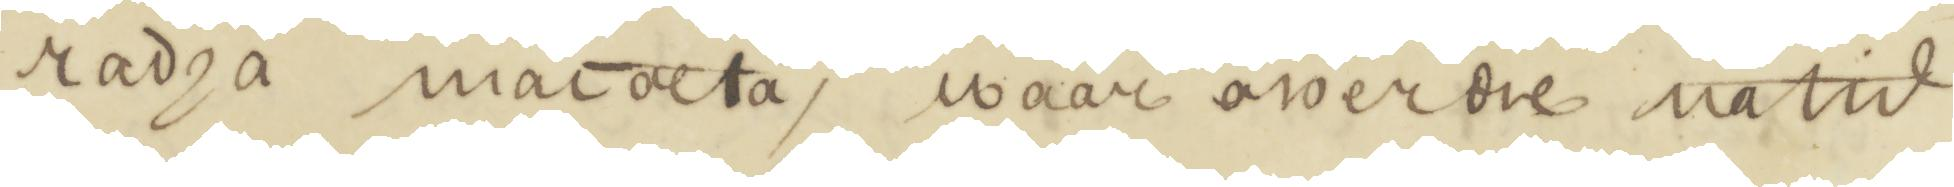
radja macoeta, waar over die natie
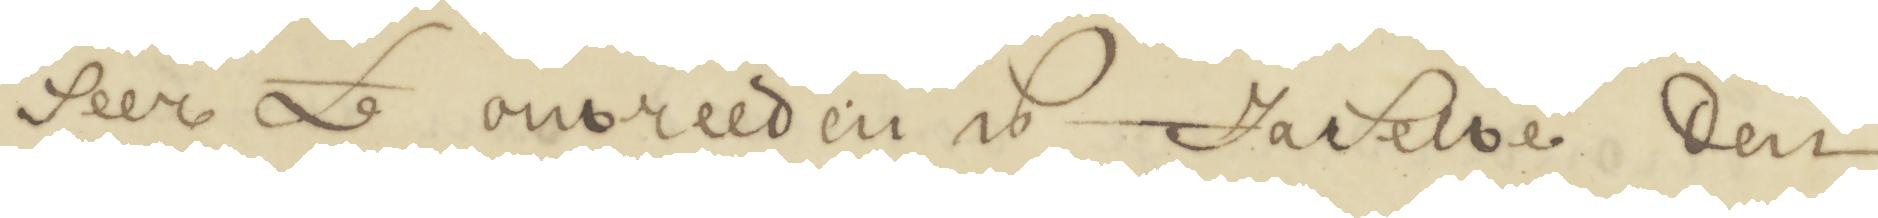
seer te onvreeden is Ia selve den
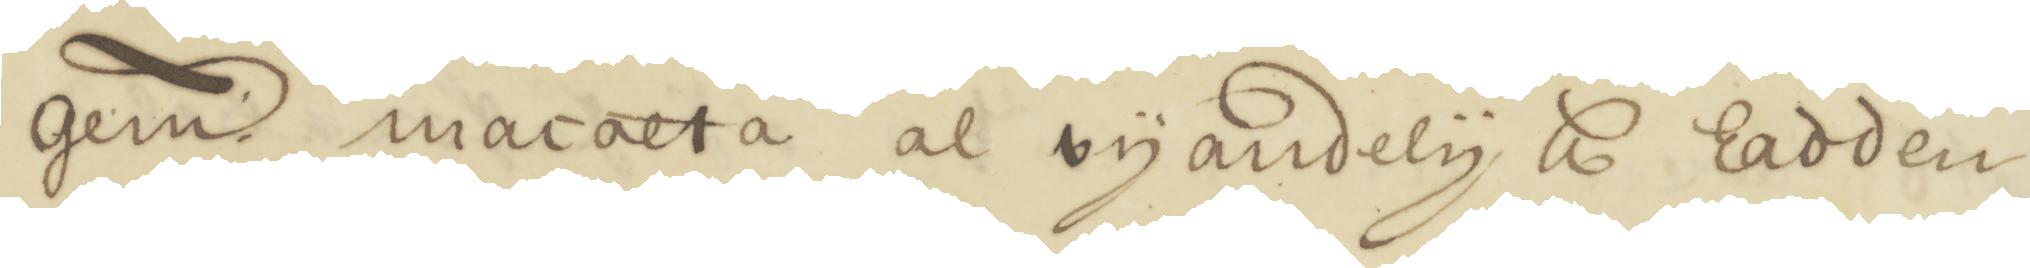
gem: macoeta al vijandelij k hadden
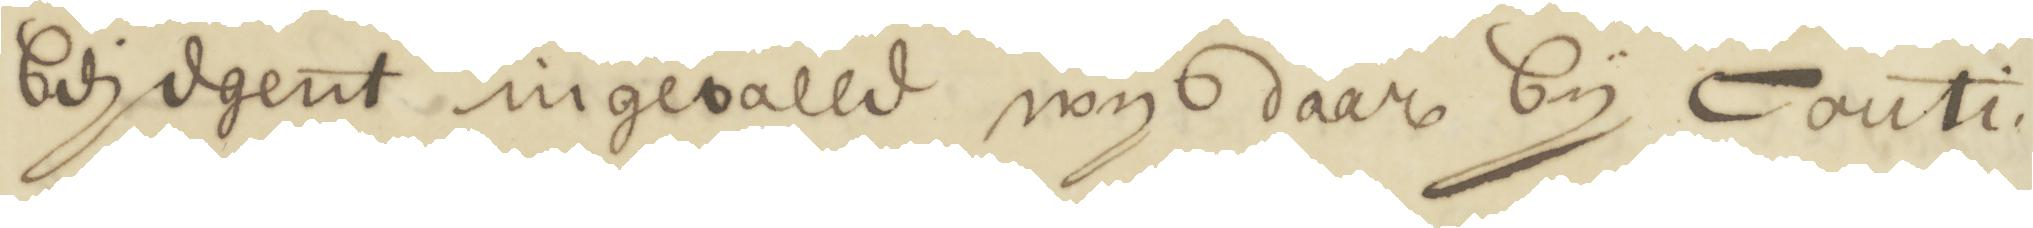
bejegent in gevalle wij daar bij conti,
